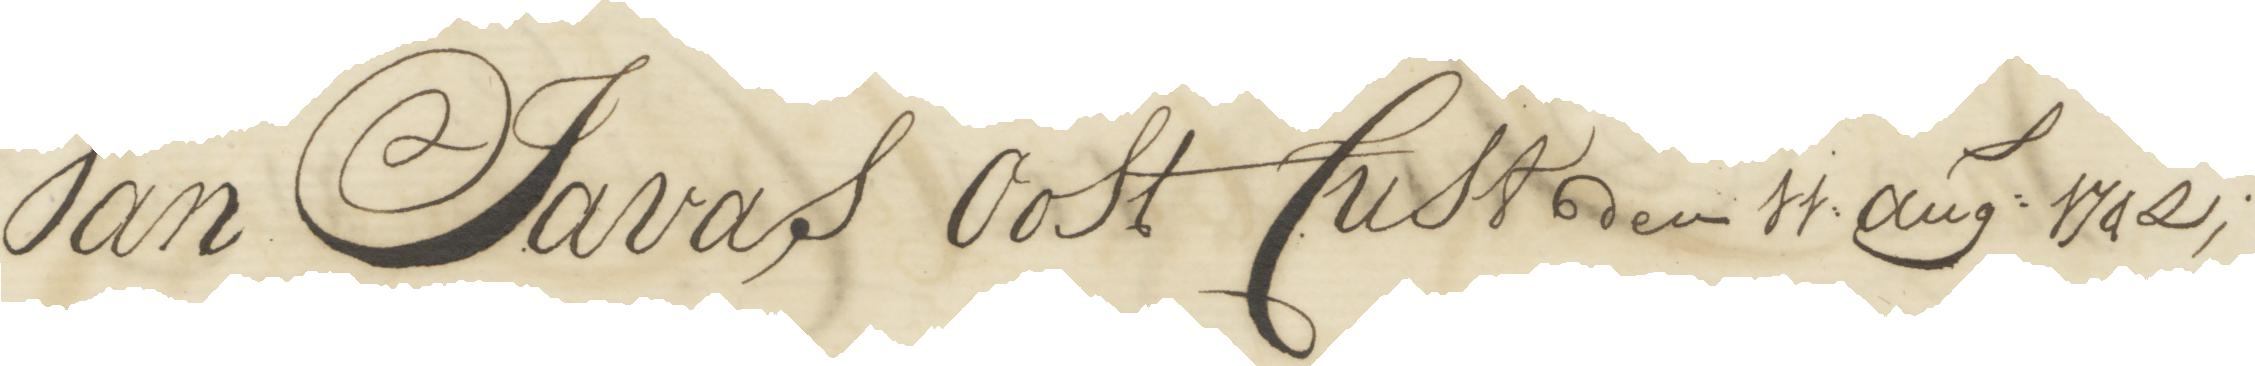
Van Javas Oost Cust den 11: aug: 1742;
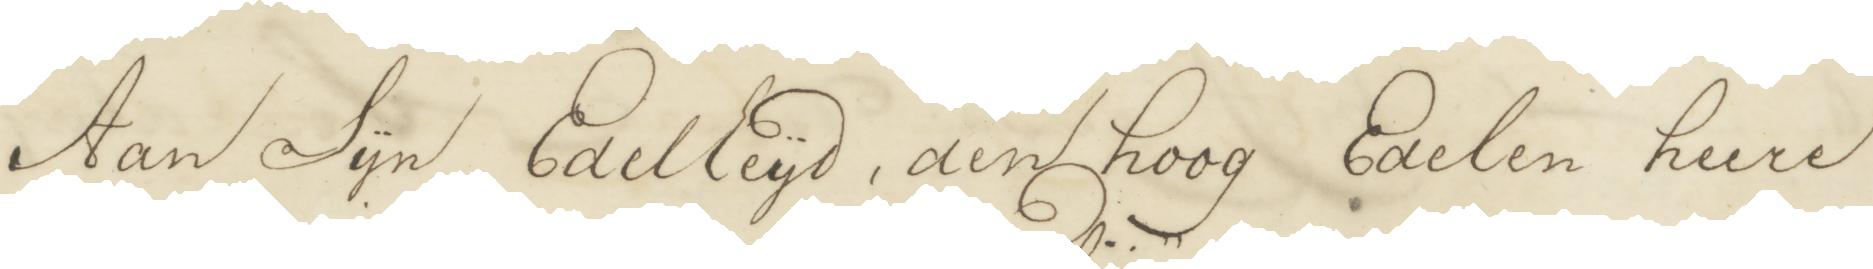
Aan Sijn Edelheijd, den hoog Edelen heere
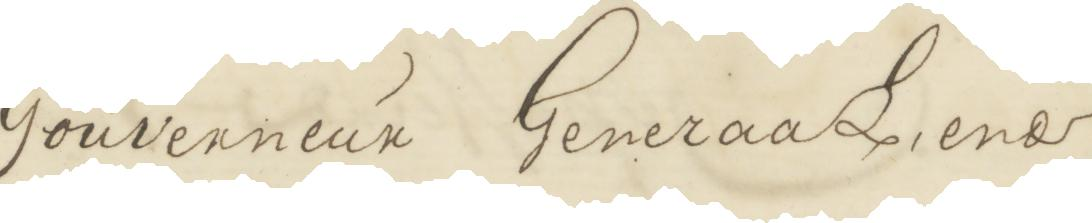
Gouverneur Generaal, ende
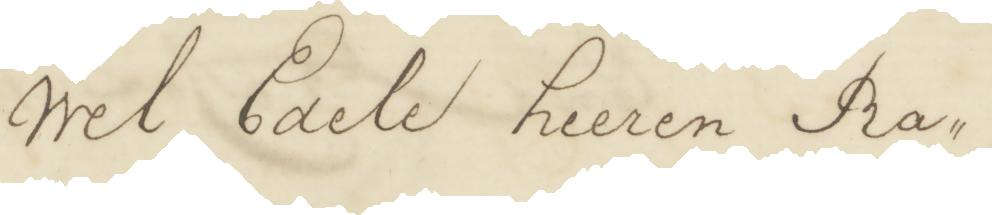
wel Edele heeren Ra„
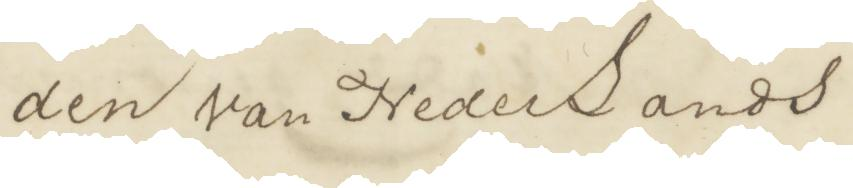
den van Nederlands
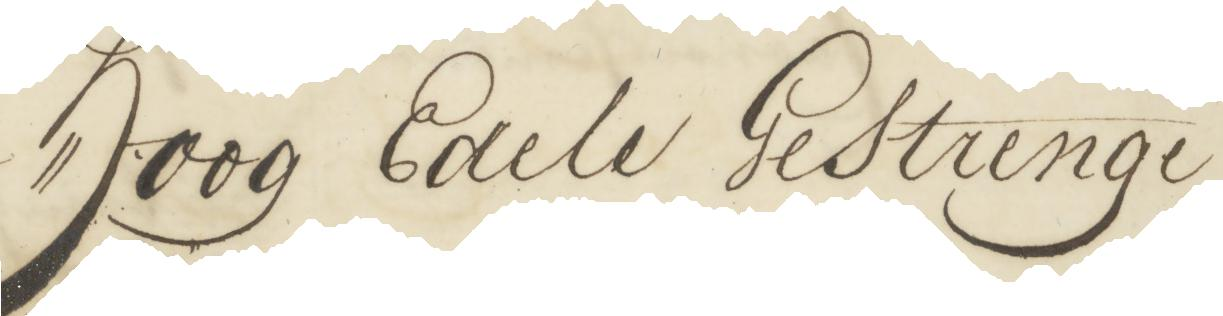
Hoog Edele Gestrenge,
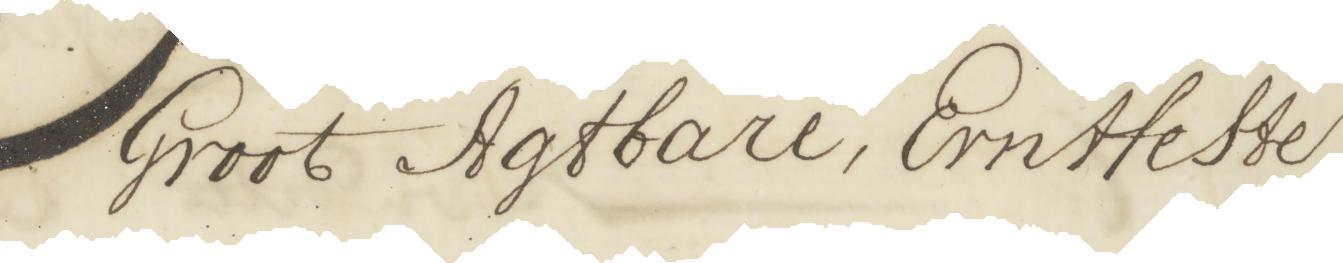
Groot Agtbare, Erntfeste,
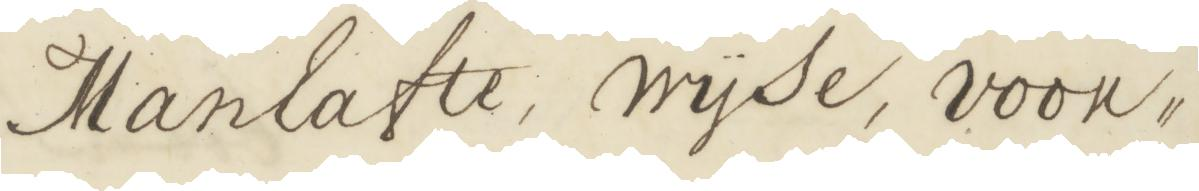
Manhafte, wijse, voor„
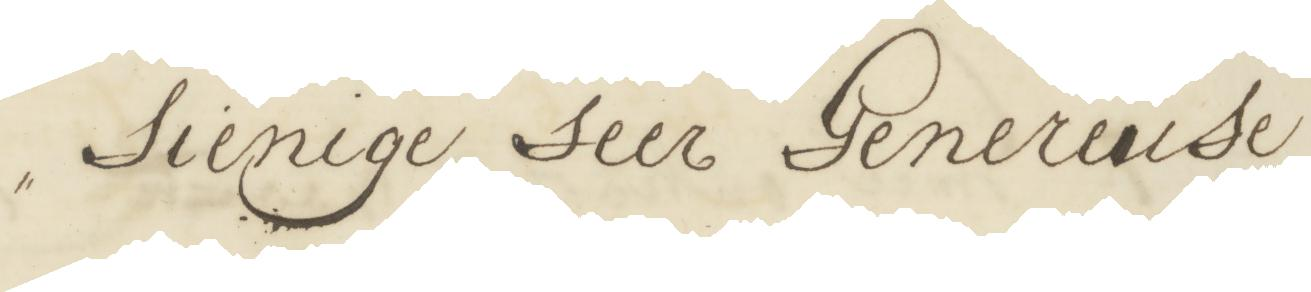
„ sienige, seer Genereuse
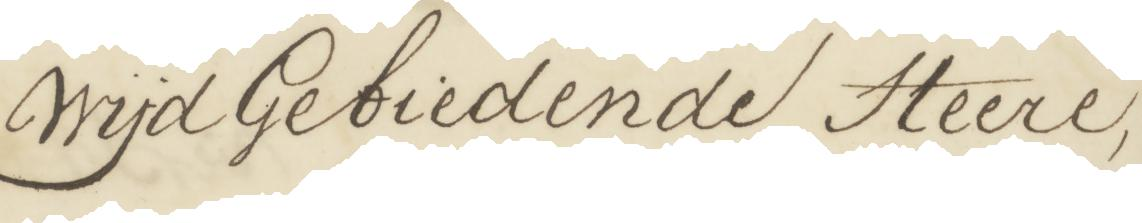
wijd Gebiedende Heere,
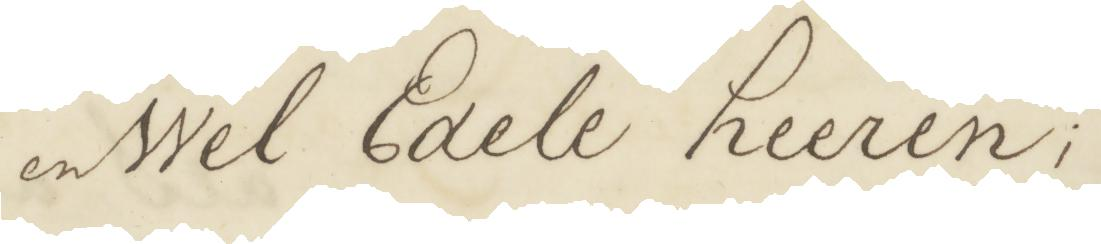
en Wel Edele heeren;
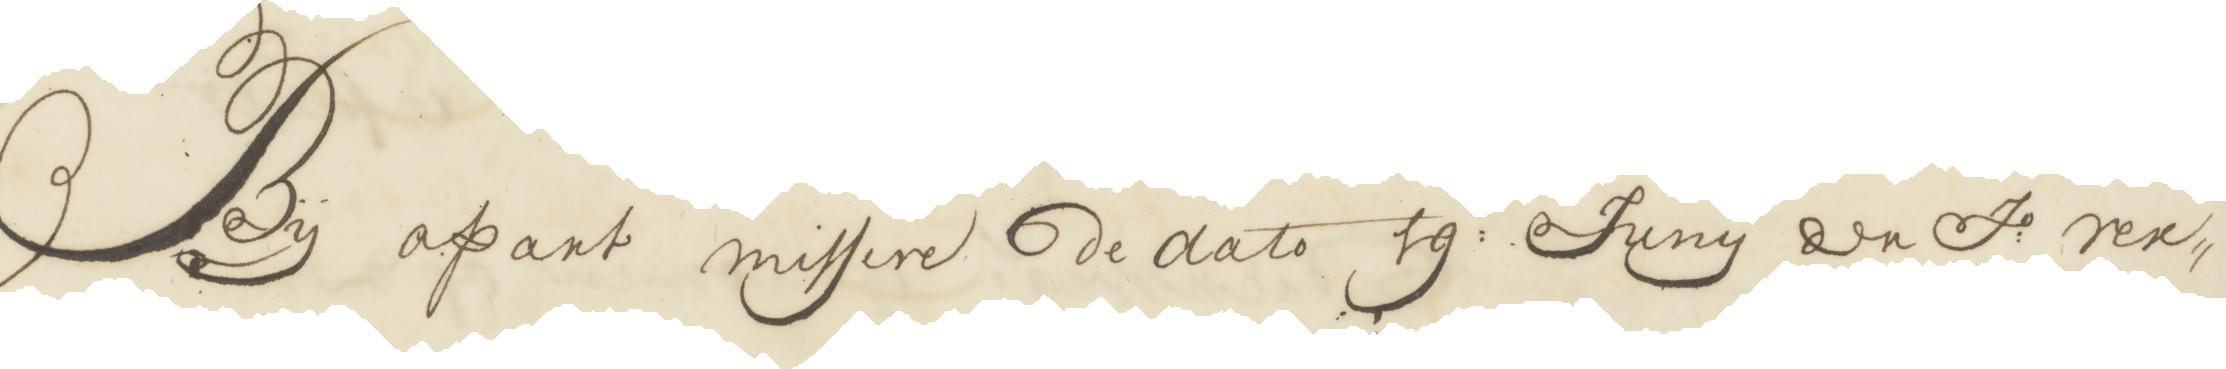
Bij apart missive de dato 19:' Junij der J:o ver„
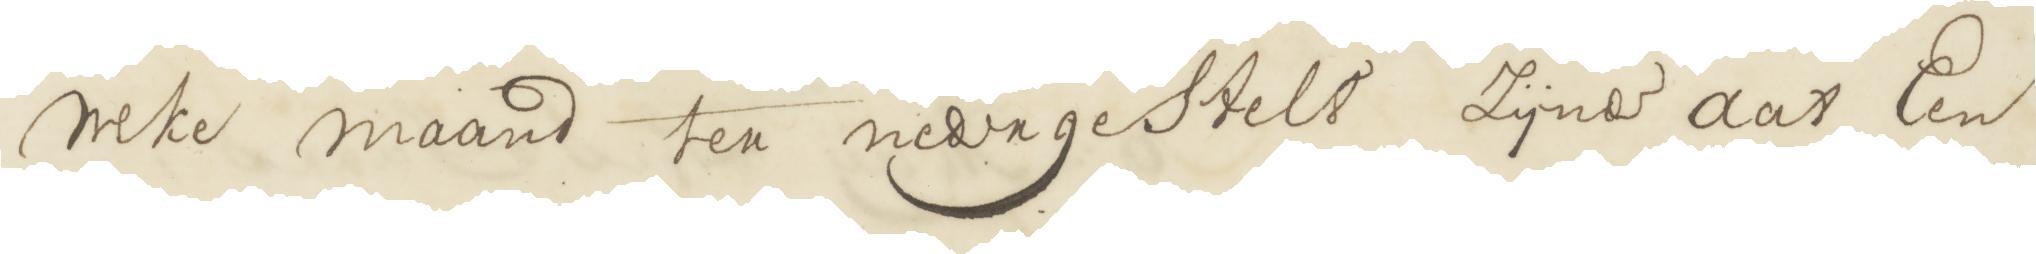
weke maand ter nedergestelt zijnde dat Een
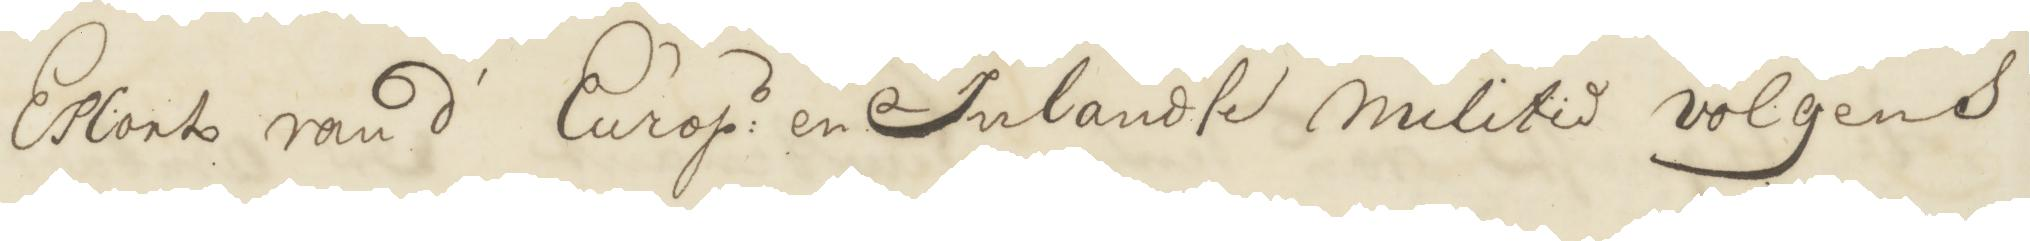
Escort van d’ Europ:s en Jnlandse militie volgens
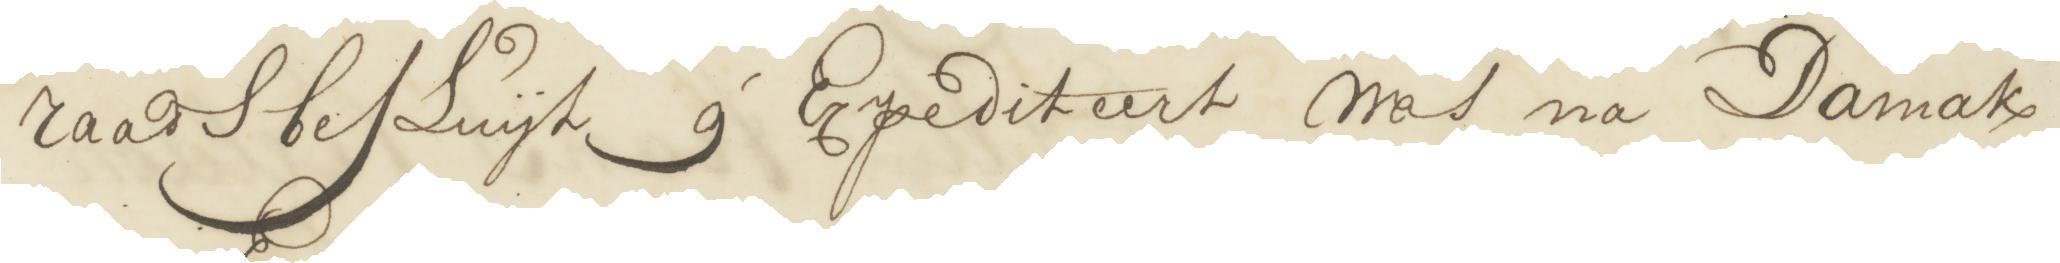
raadsbesluijt g’ Expediteert was na Damak
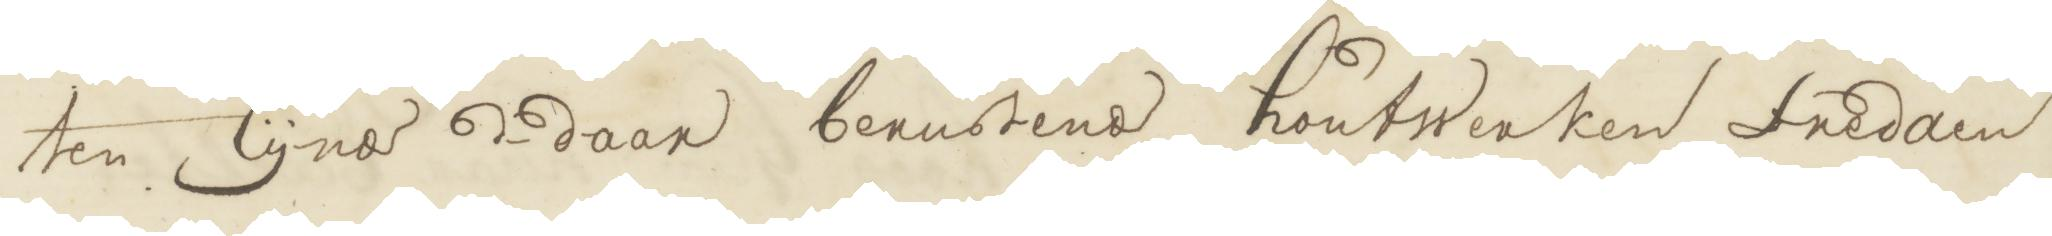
ten Eijnde de daar berustende houtwerken tredaen
